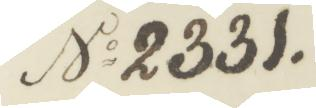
N:o 2331.
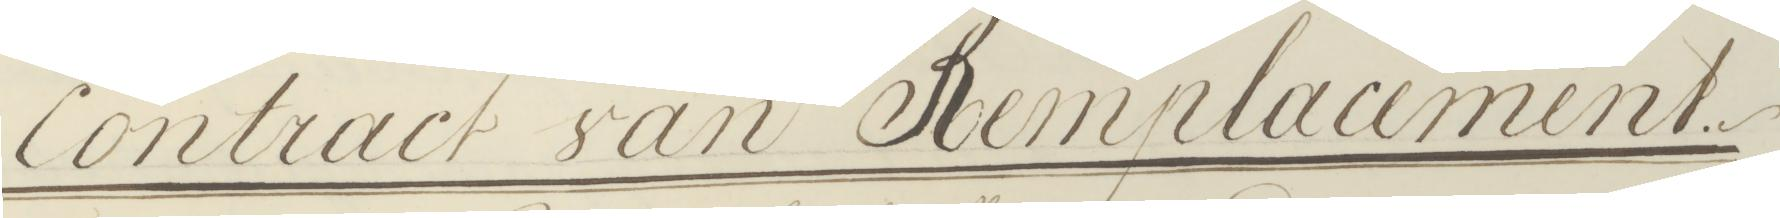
Contract van Remplacement.-
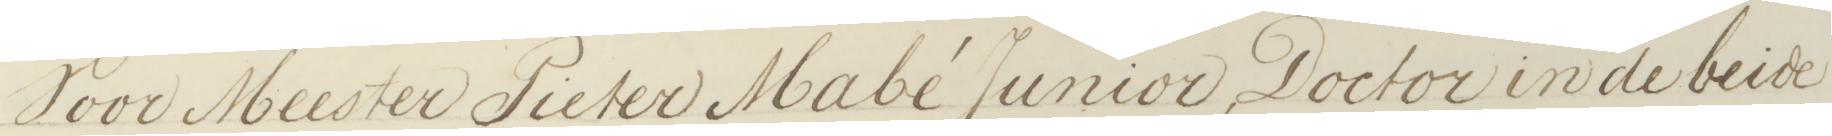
Voor Meester Pieter Mabé Junior, Doctor in de beide
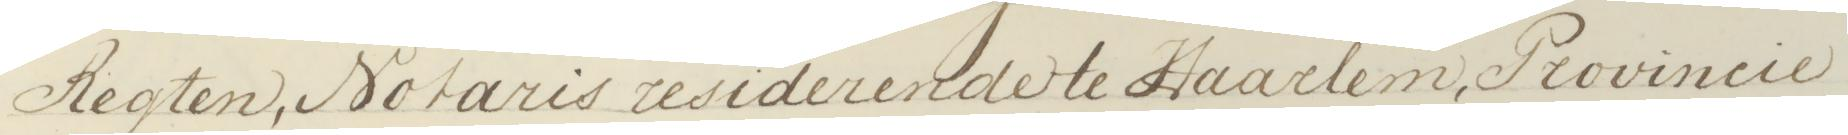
Regten, Notaris residerende te Haarlem, Provincie
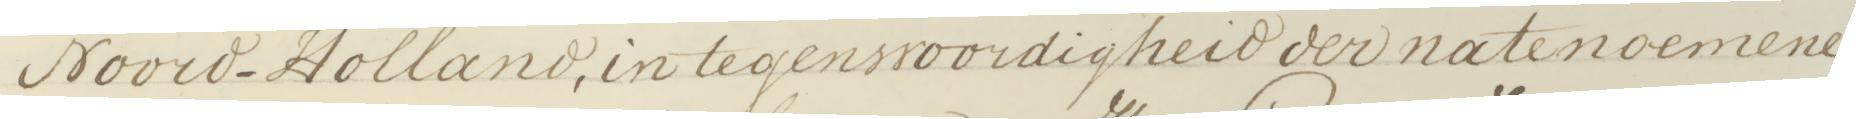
Noord-Holland, in tegenwoordigheid der na tenoemene
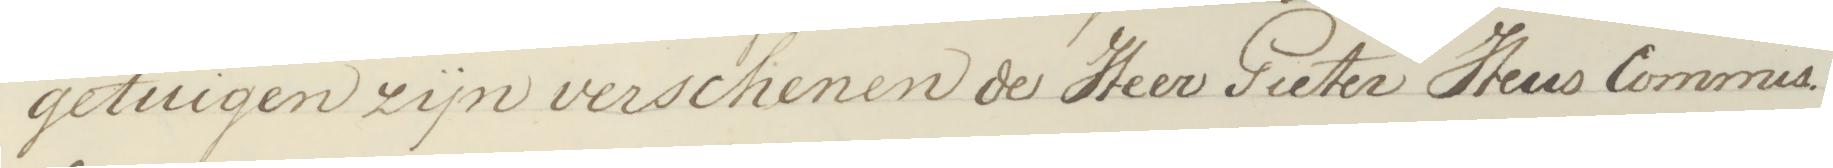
getuigen zijn verschenen de Heer Pieter Heus Commis.
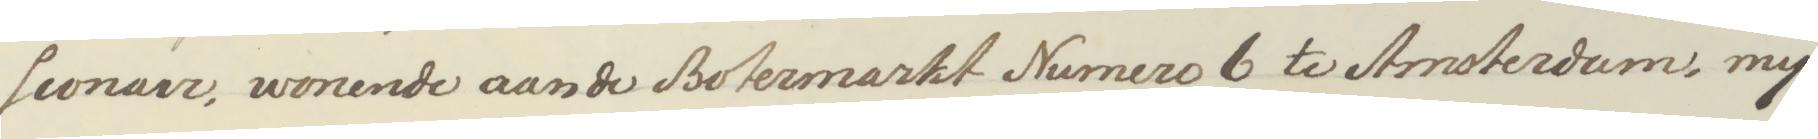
sionair, wonende aan de Botermarkt Numero 6 te Amsterdam, my
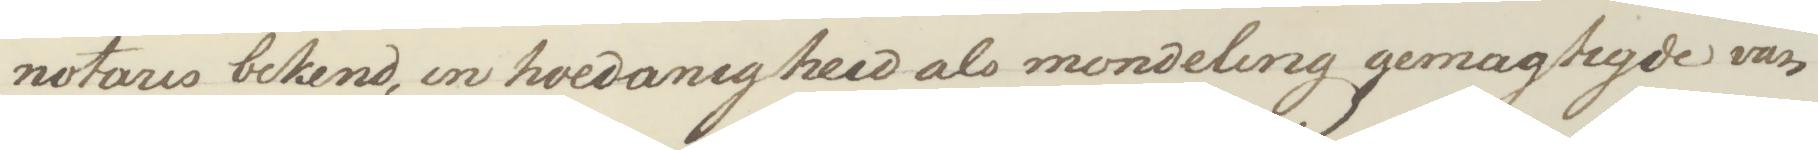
notaris bekend, in hoedanigheid als mondeling gemagtigde van
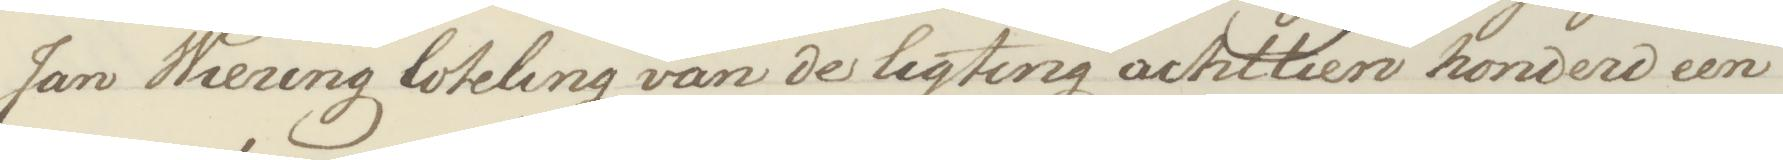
Jan Wiering loteling van de ligting achttien honderd een
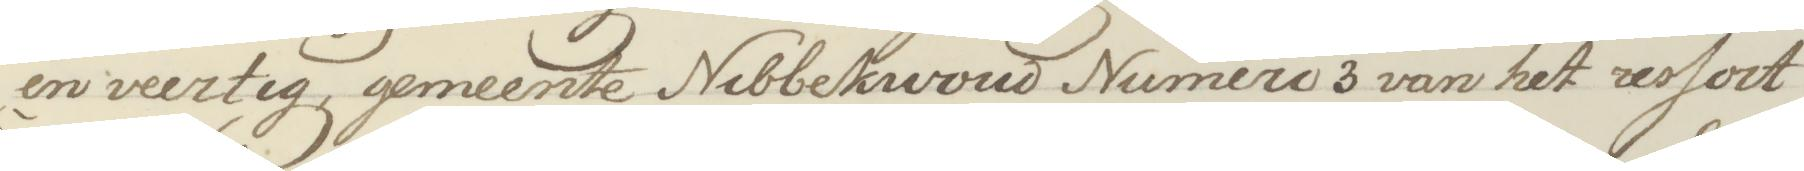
en veertig, gemeente Nibbekwoud Numero 3 van het ressort
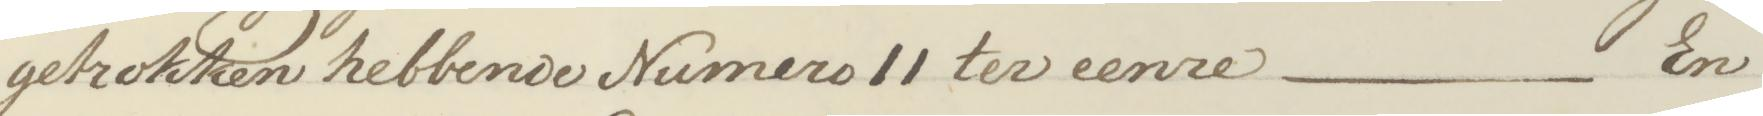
getrokken hebbende Numero 11 ter eenre — En
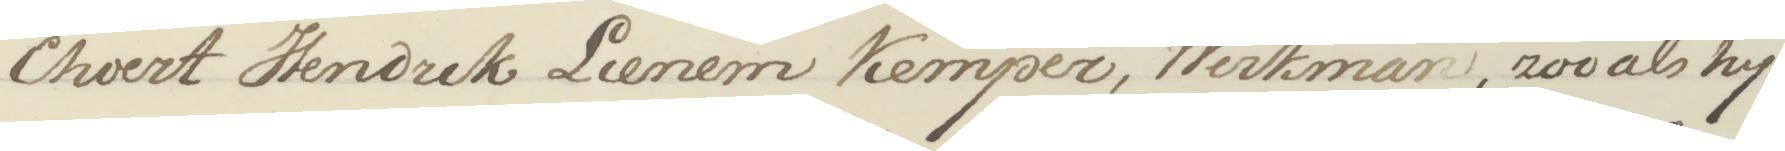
Choert Hendrik Lienem Kemper, Werkman, zoo als hy
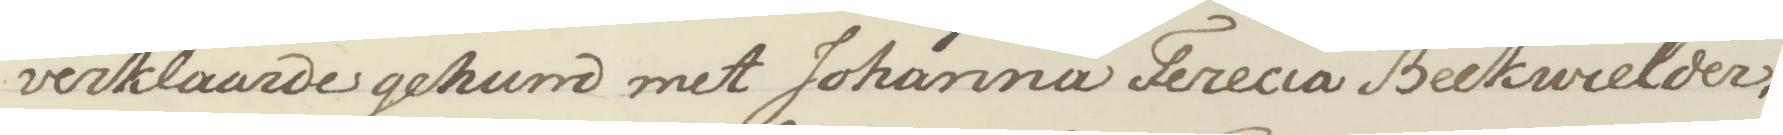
verklaarde gehuwd met Johanna Terecia Beckwielder,
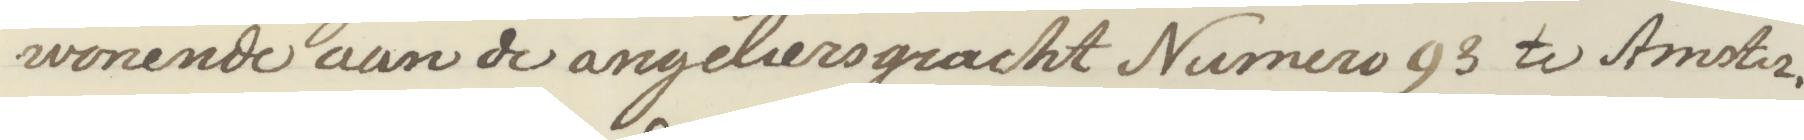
wonende aan de angeliersgracht Numero 93 te Amster
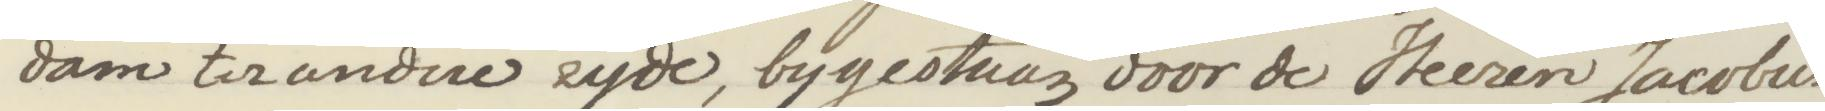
dam ter andere zijde, bijgestaan door de Heeren Jacobus
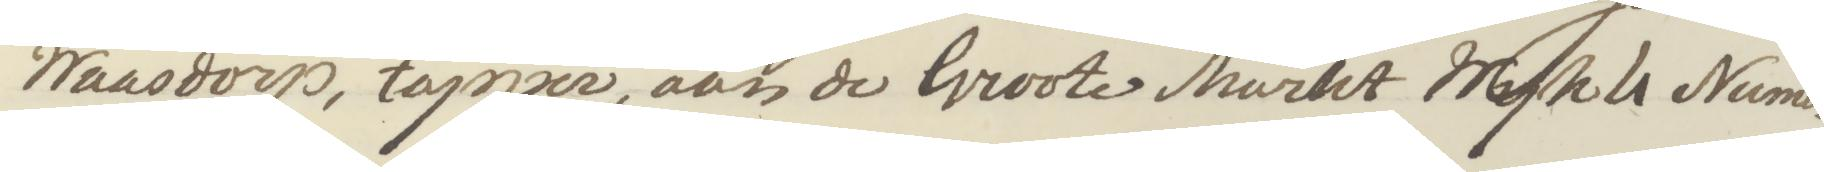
Waasdorp, tapper, aan de Groote Markt Wyk 4 Nume
